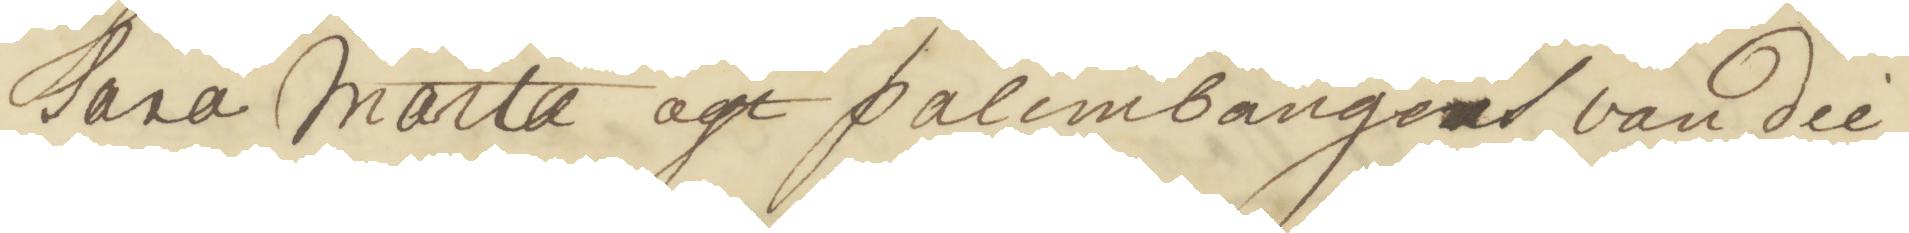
Sara Marta agt palembangers van die
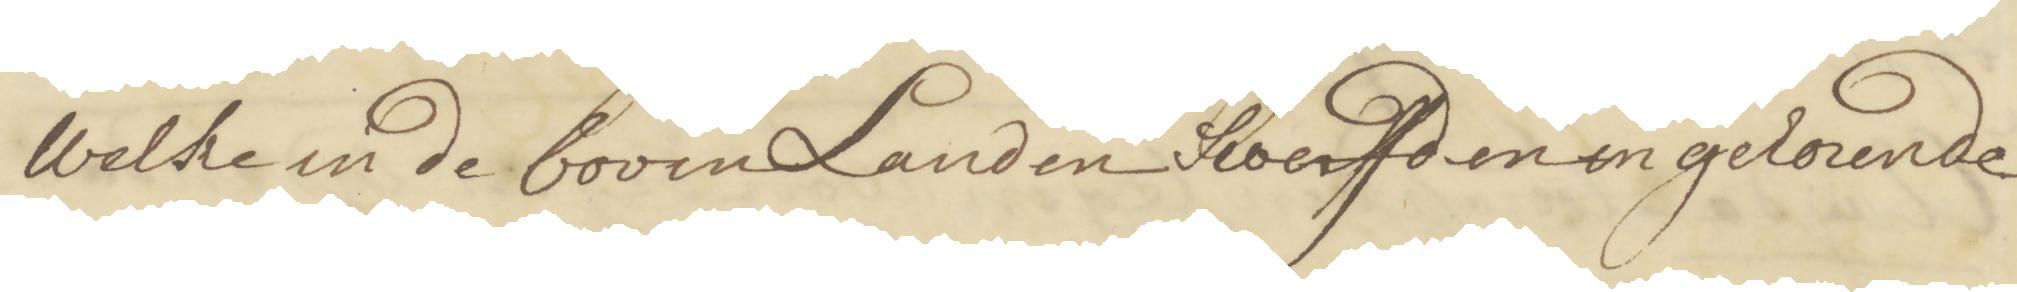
welke in de boven Landen swerffden en gehorende
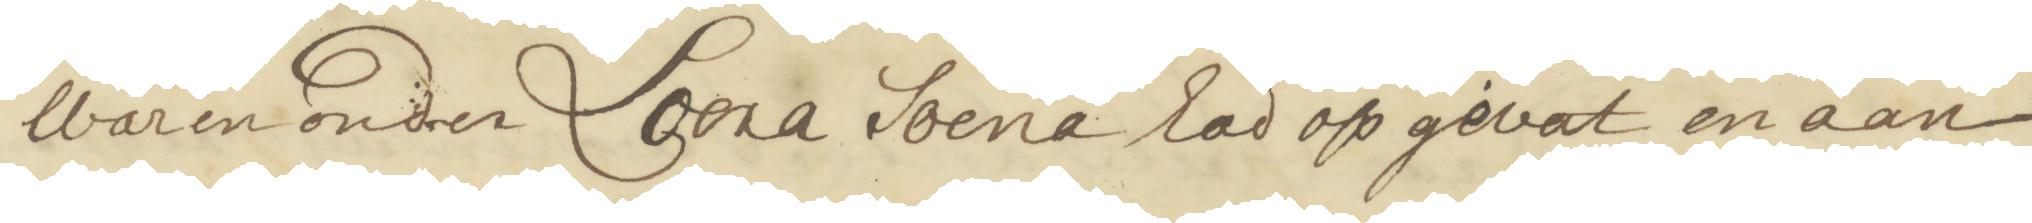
waren onder Loera soena had op gevat en aan
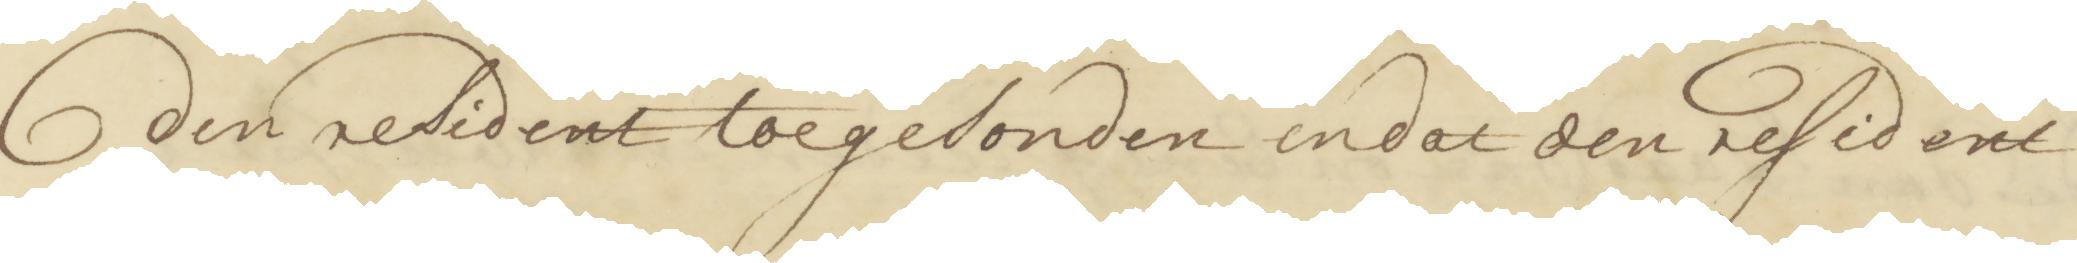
den resident toegesonden en dat den resident
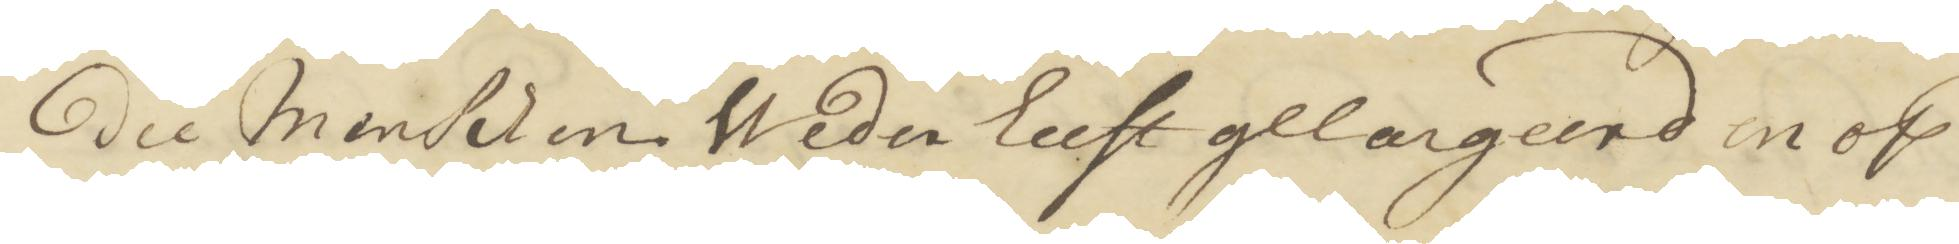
die menschen weder heeft gelargeerd en op
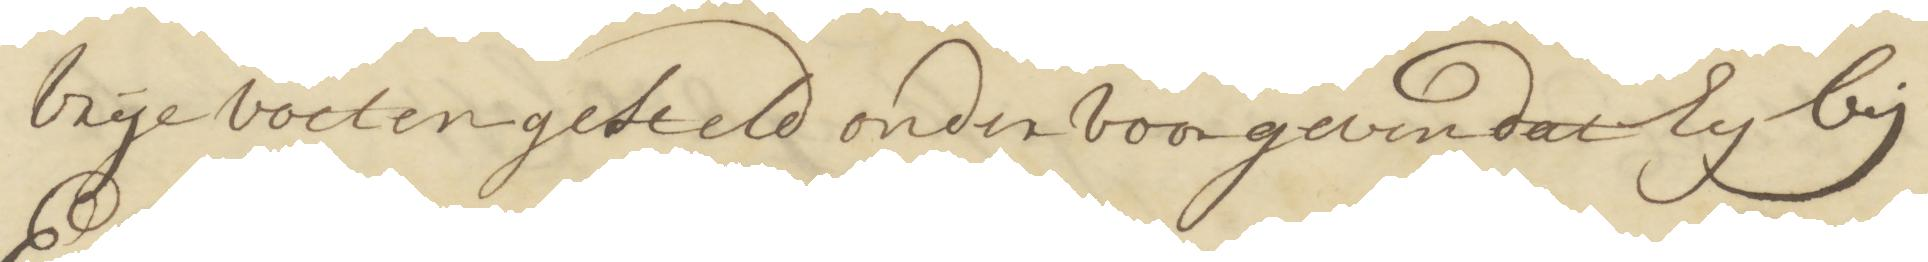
vrije voeten gesteld onder voorgeven dat hij bij
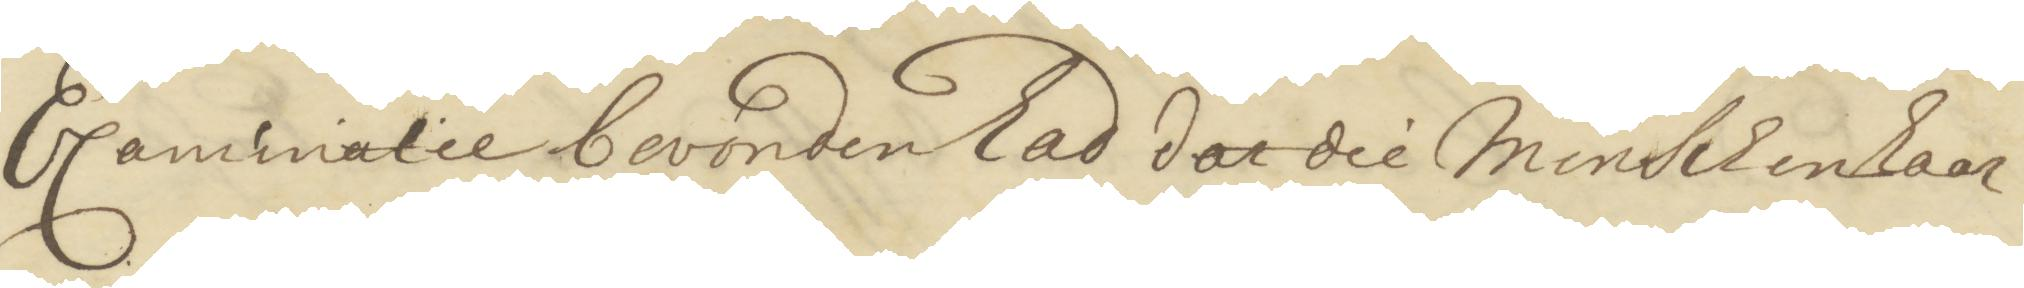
Examinatie bevonden had dat die menschen haar
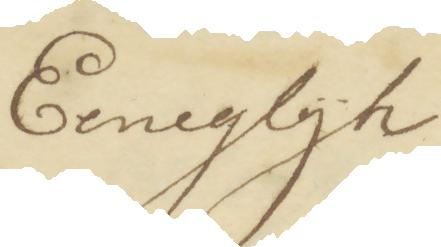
Eeniglijk
